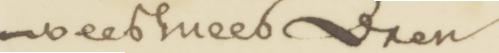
weesmeesteren
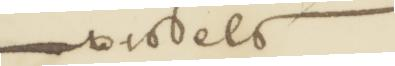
wissels
